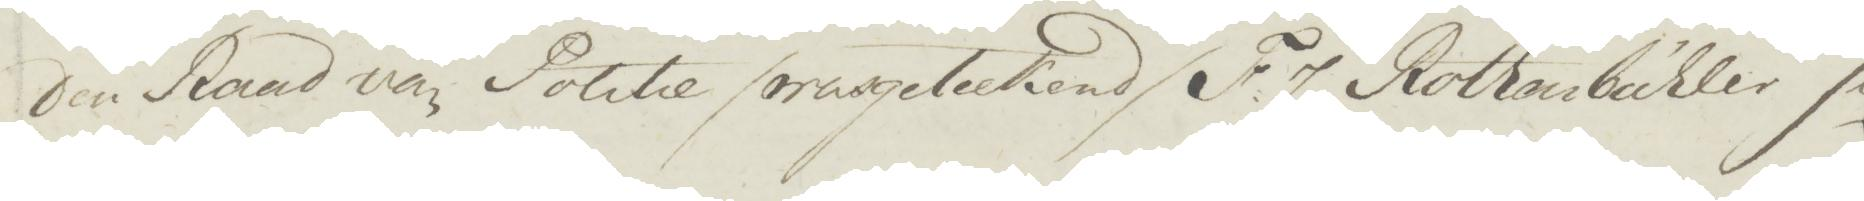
den Raad van Politie /wasgeteekend/ F: J: Rothenbuhler seC„s
